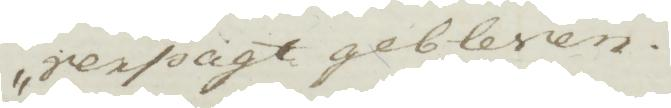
„verpagt gebleven.
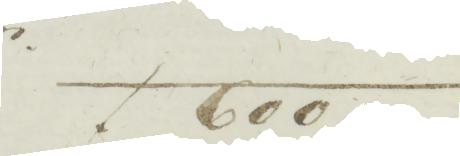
ƒ 600 -, -
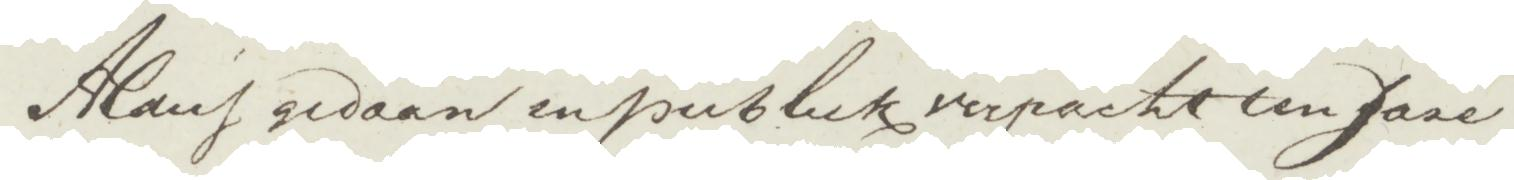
Aldus gedaan en publiek verpacht ten Jare
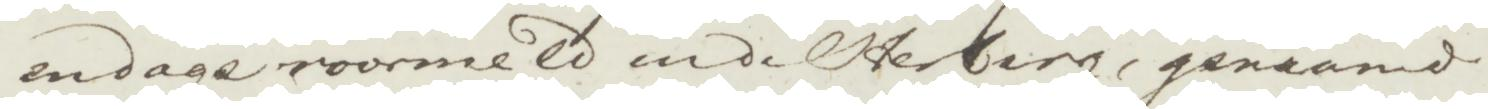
en dage voormeld in de Herberg, genaamd
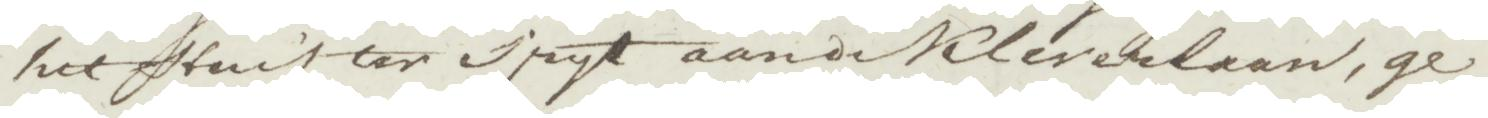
het Huis ter spijt aan de Kleverlaan, ge
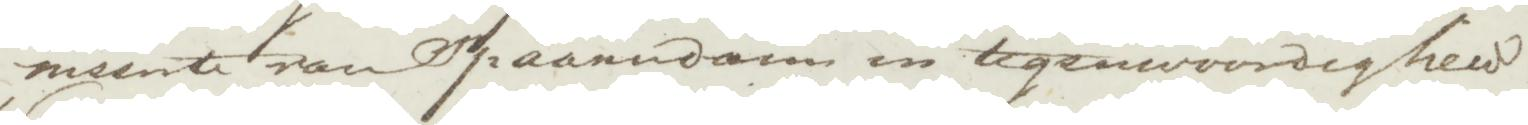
meente van Spaarndam in tegenwoordigheid
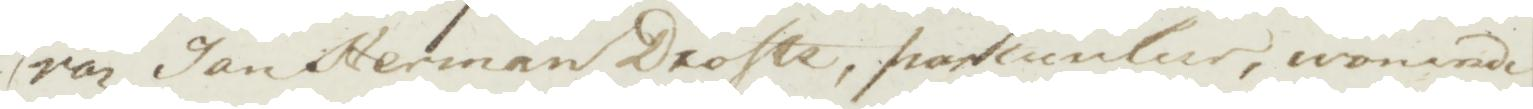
van Ian Herman Droste, particulier, wonende
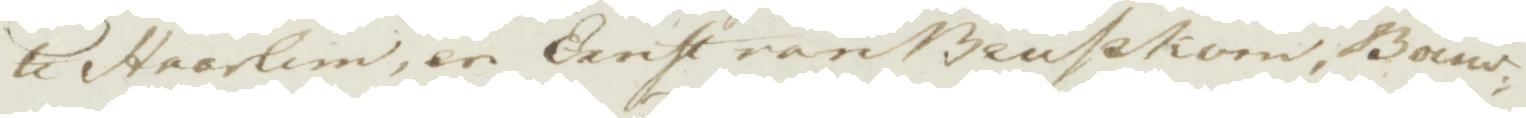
te Haarlem, en Ernst van Beusekom, Bouw„
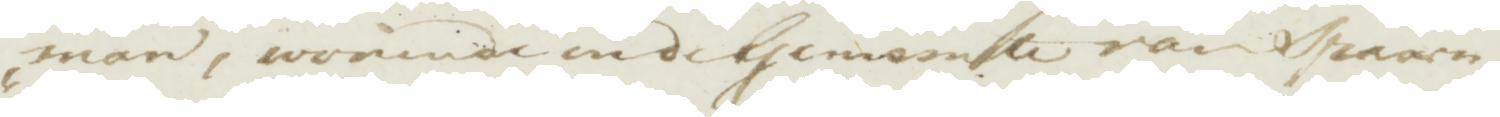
„man, wonende in de Gemeente van Spaarn=
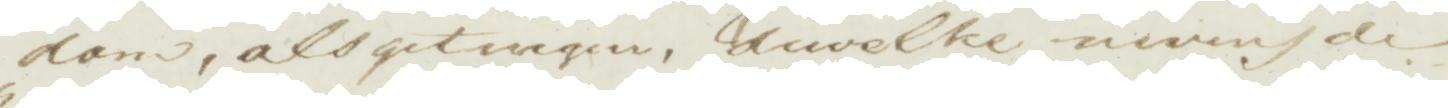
dam, als getuigen, dewelke nevens de
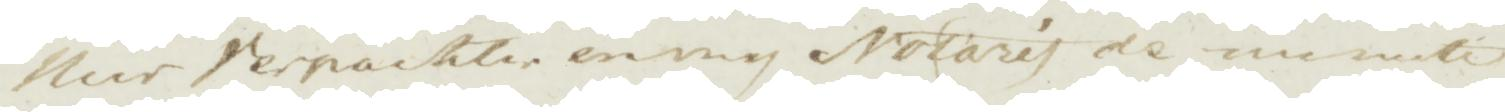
Heer Verpachter en my Notaris de minute
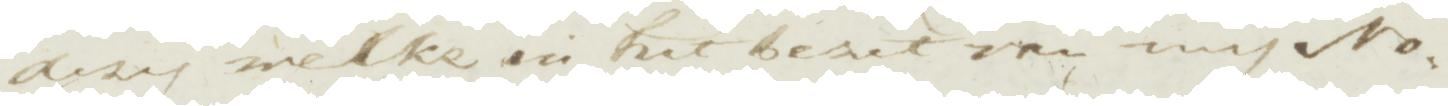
dezes welke in het bezit van my No„
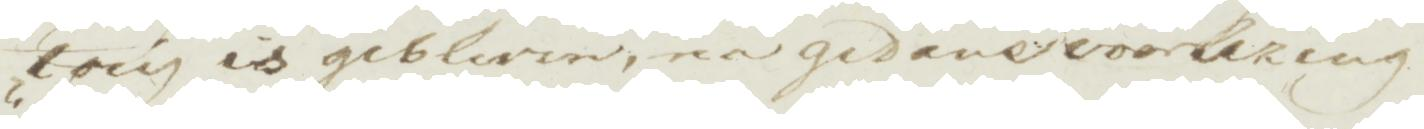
„taris is gebleven, na gedane voorlezing
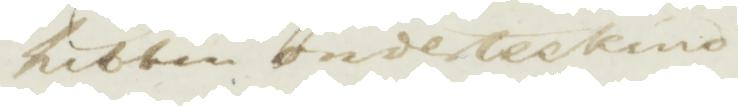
hebben, onderteekend
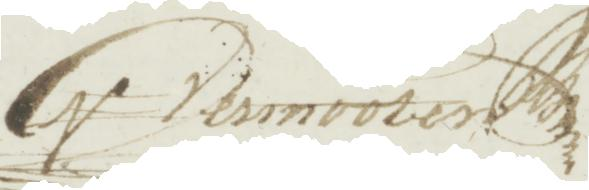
G: Vermooten
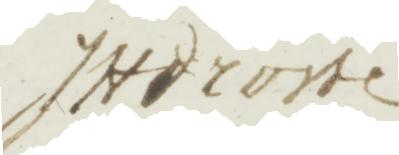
J H Droste
